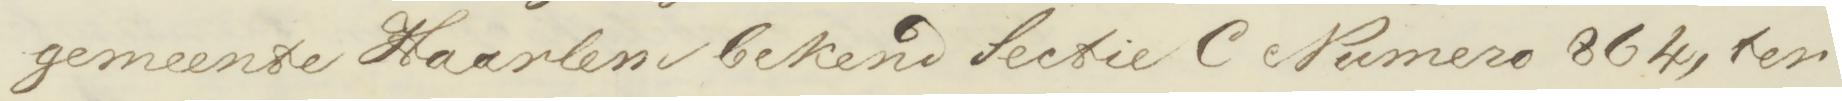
gemeente Haarlem bekend sectie C Numero 864, ter
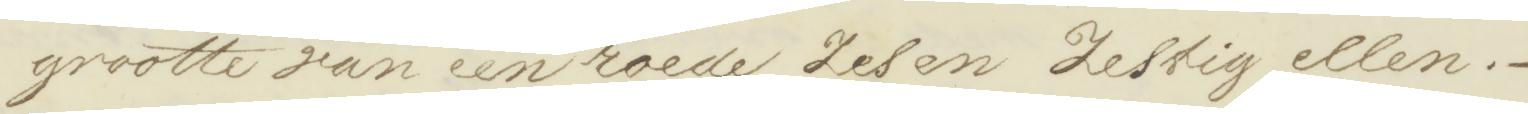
grootte van een roede zes en Zestig ellen.-
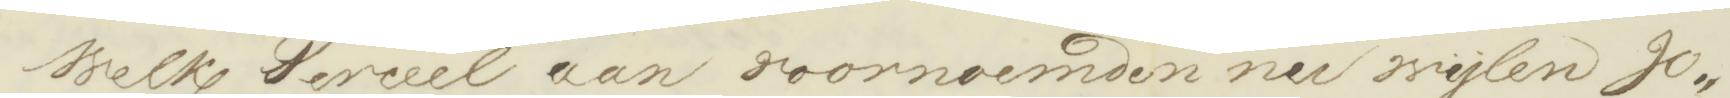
Welk Perceel aan voornoemden nu wijlen zo„
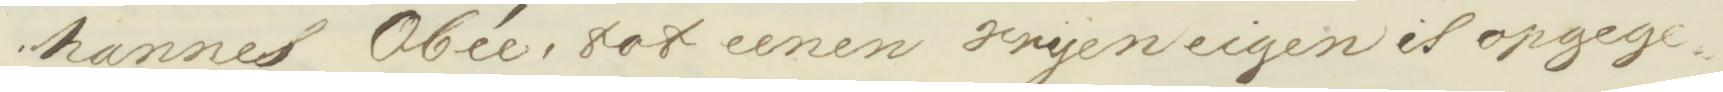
hannes Obée, tot eenen vrijen eigen is opgege„
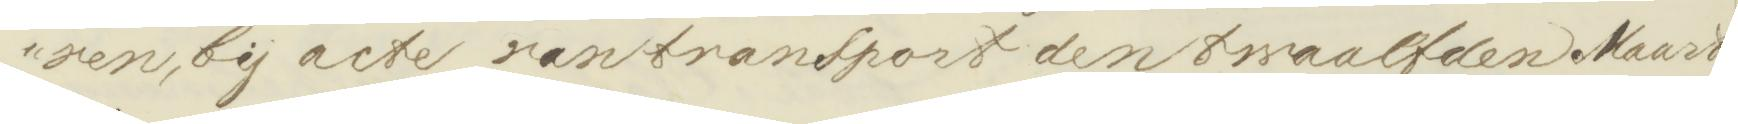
„ven, bij acte van transport den twaalfden Maart
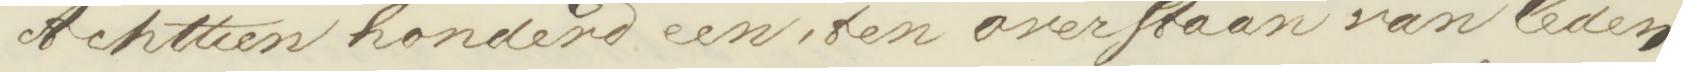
Achttien honderd een, ten overstaan van leden
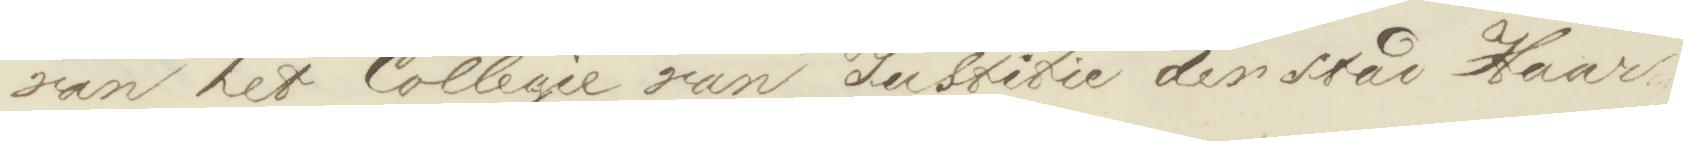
van het Collegie van Iustitie der stad Haar„
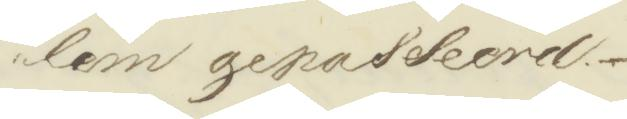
„lem gepasseerd.-
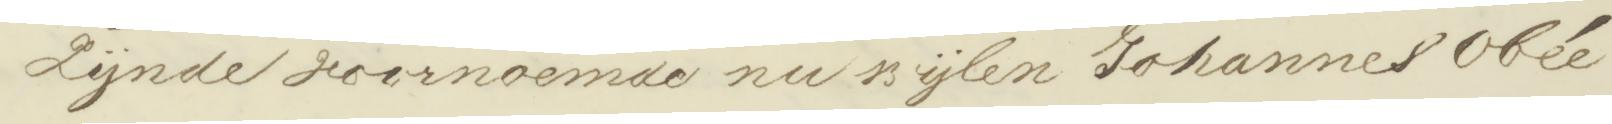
Zijnde voornoemde nu wijlen Iohannes Obée
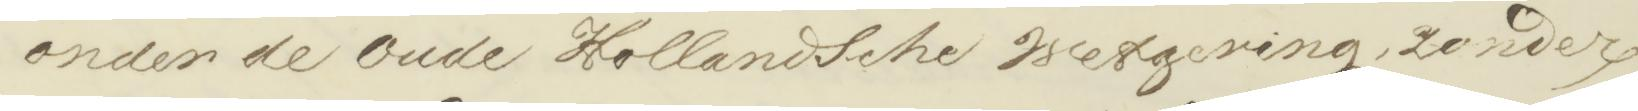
onder de oude Hollandsche Wetgeving, zonder
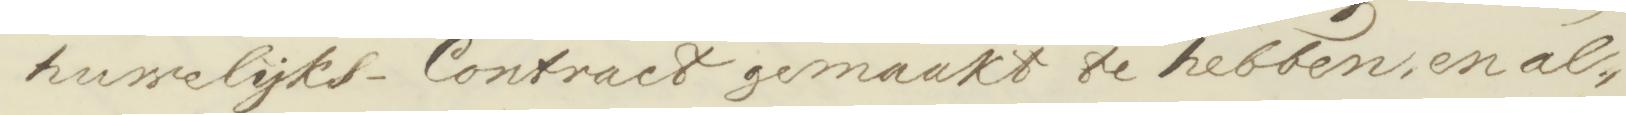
huwelijks- Contract gemaakt te hebben, en al„
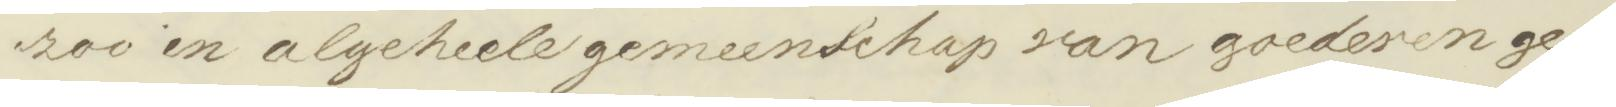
zoo in algeheele gemeenschap van goederen ge
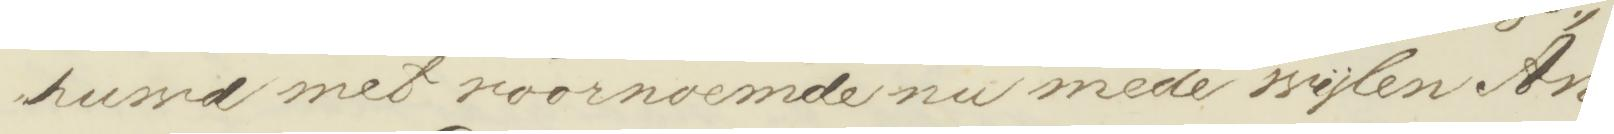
„nuwd met voornoemde nu mede wijlen An
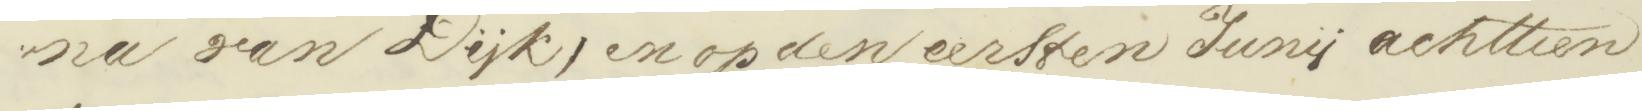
„na van Dijk, en op den eersten Iunij achttien
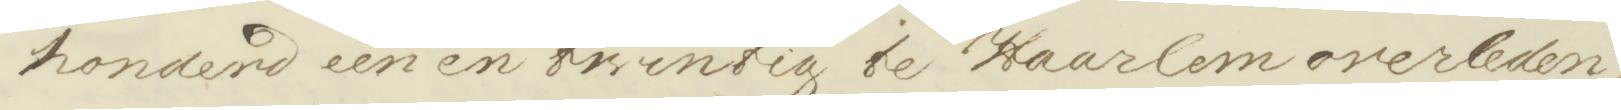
honderd een en twintig te Haarlem overleden
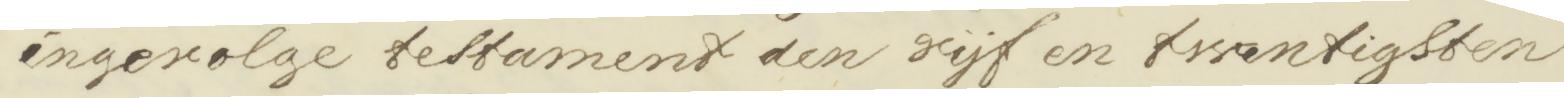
ingevolge testament den vijf en twintigsten
